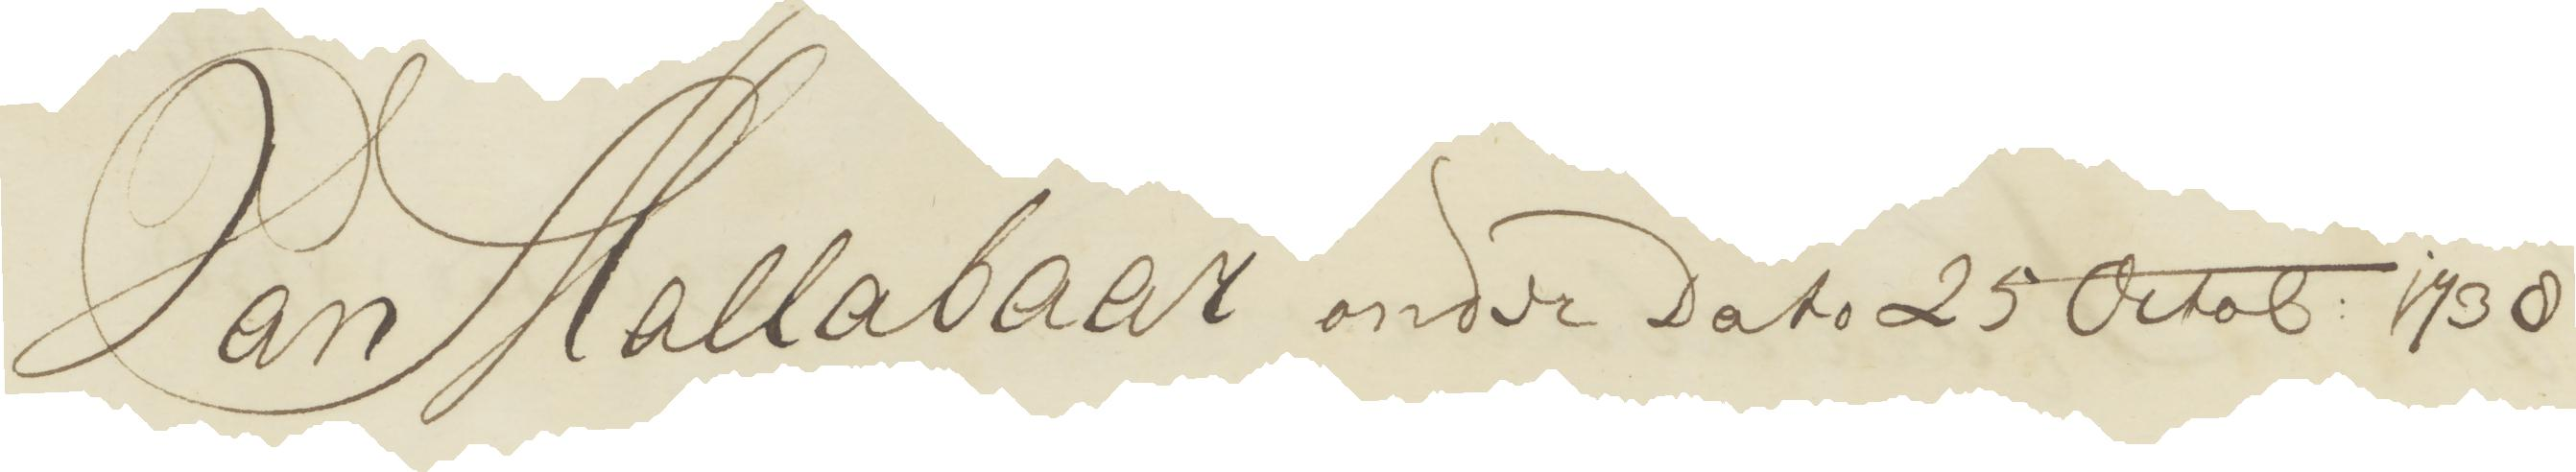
Van Mallabaar onder dato 25 Octob: 1738
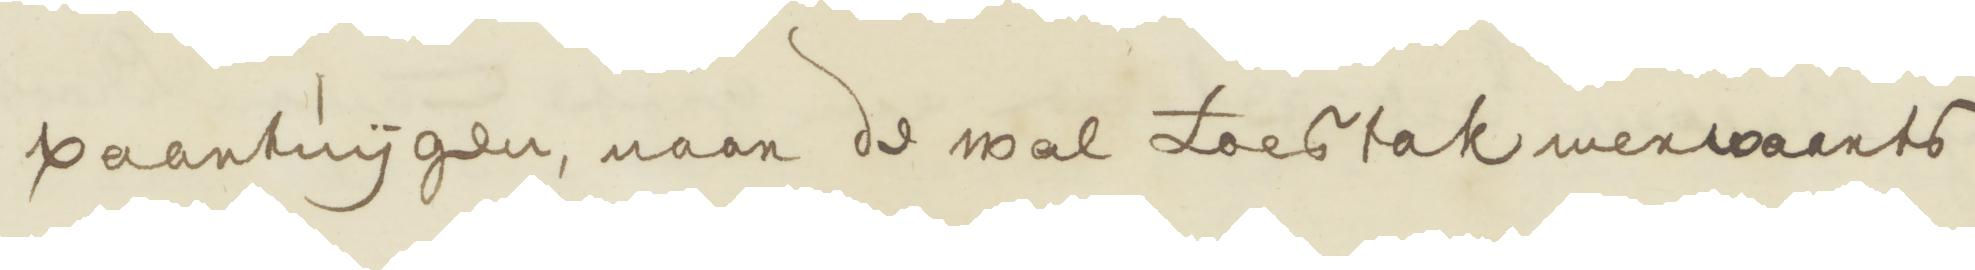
vaartuijgen, naar de wal toestak werwaarts
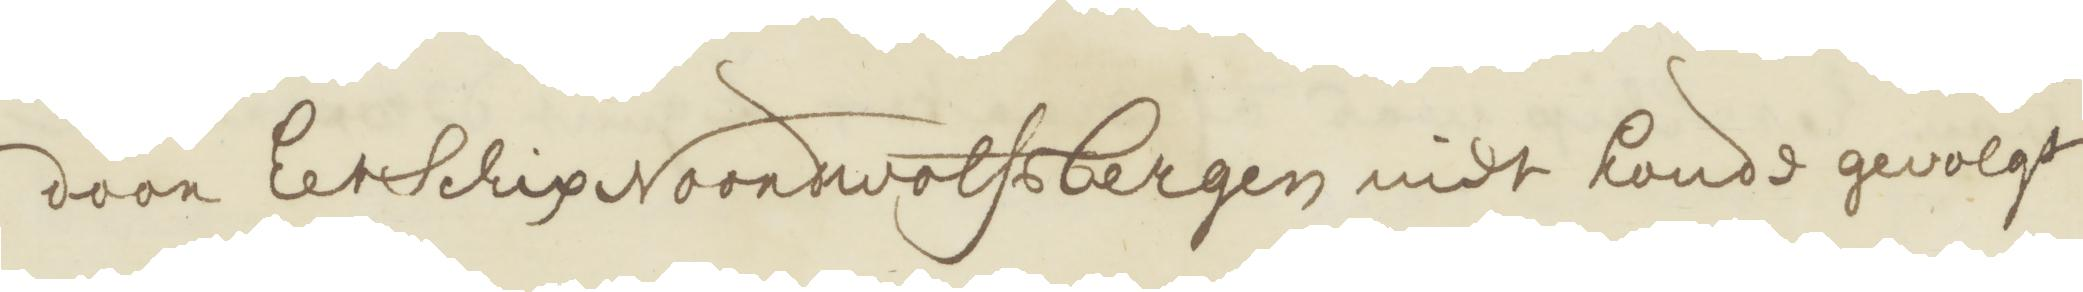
door het schip Noordwolfsbergen niet konde gevolgt
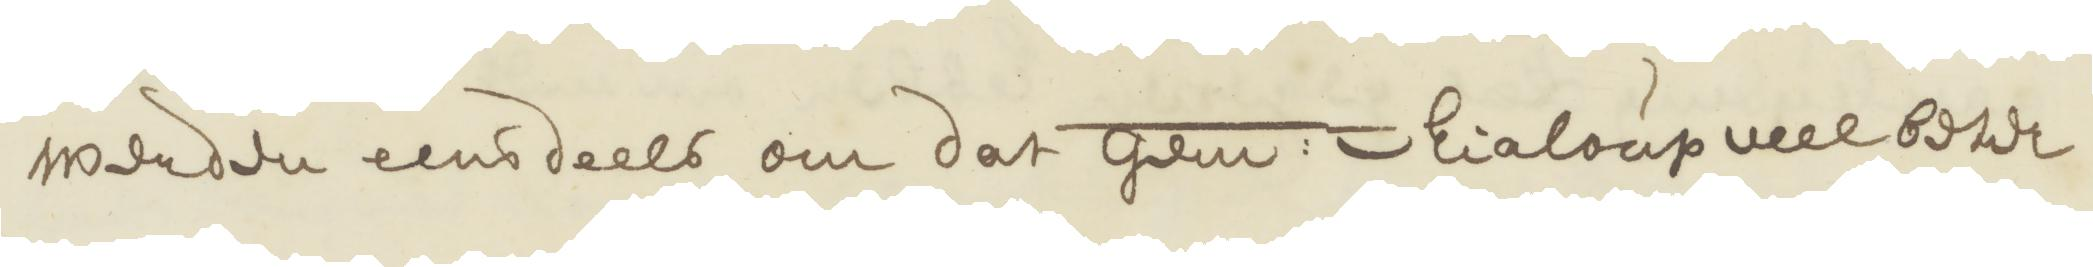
werden eensdeels om dat gem: Chialoup veel beter
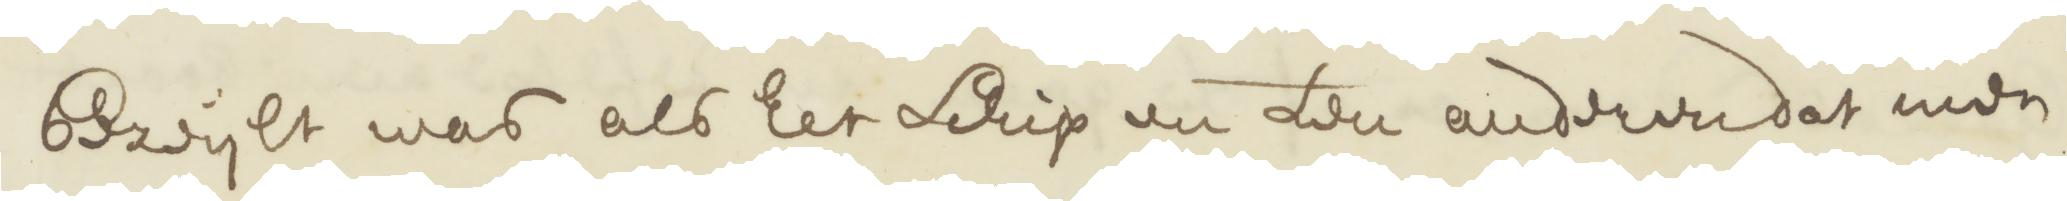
bezeijlt was als het schip en ten anderen dat men
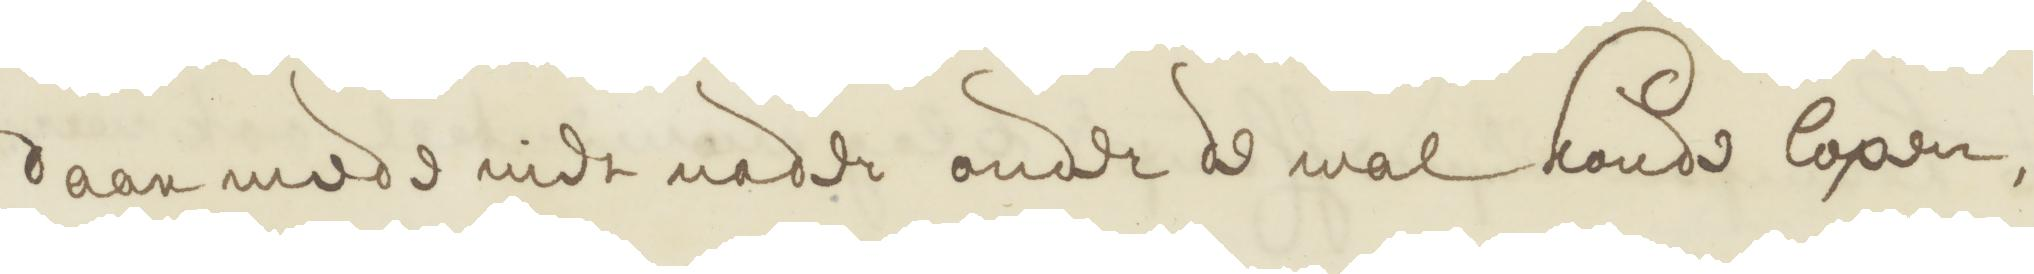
daar mede niet nader onder de wal konde lopen,
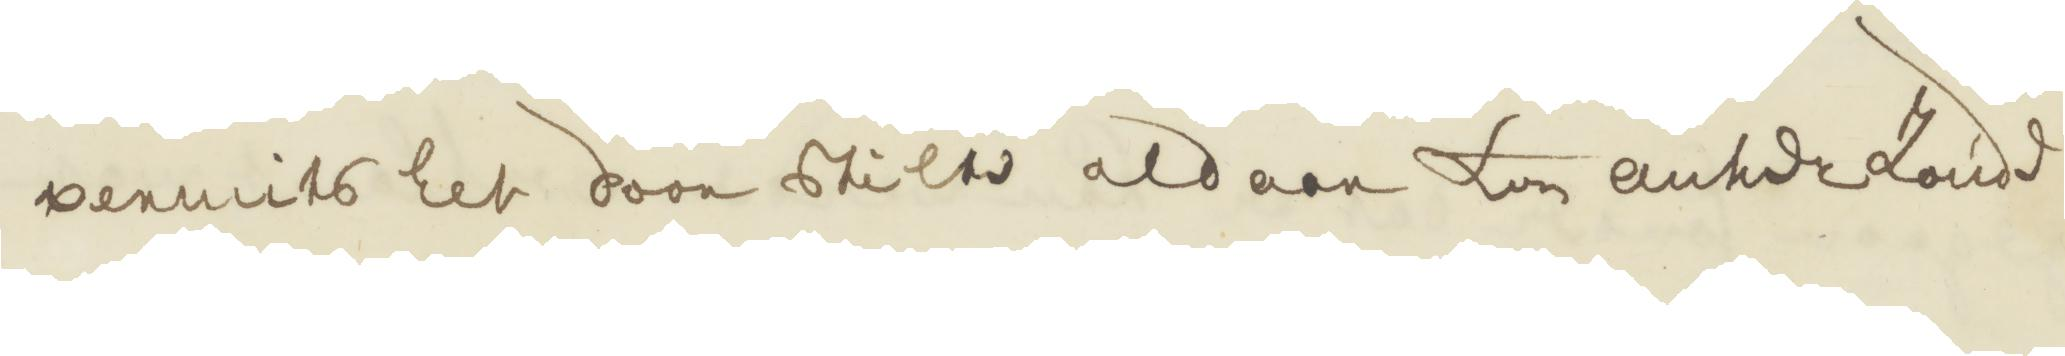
vermits het door stilte aldaar ten anker zoude
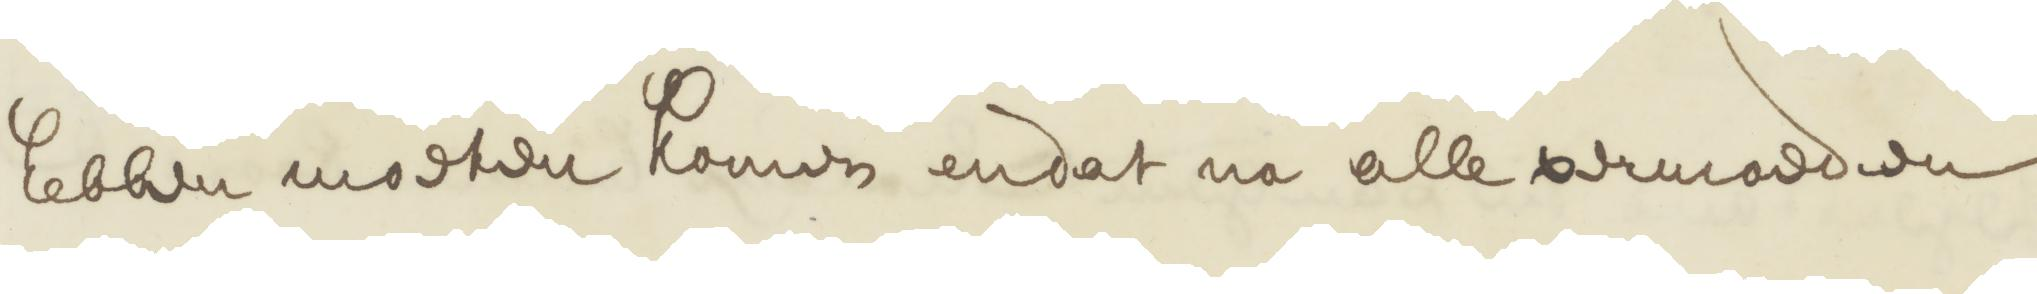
hebben moeten komen en dat na alle vermoeden
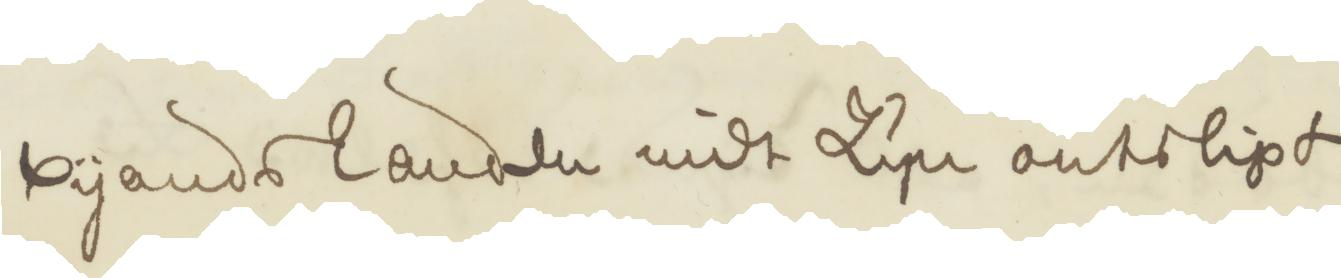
vijands handen niet zijn ontslipt
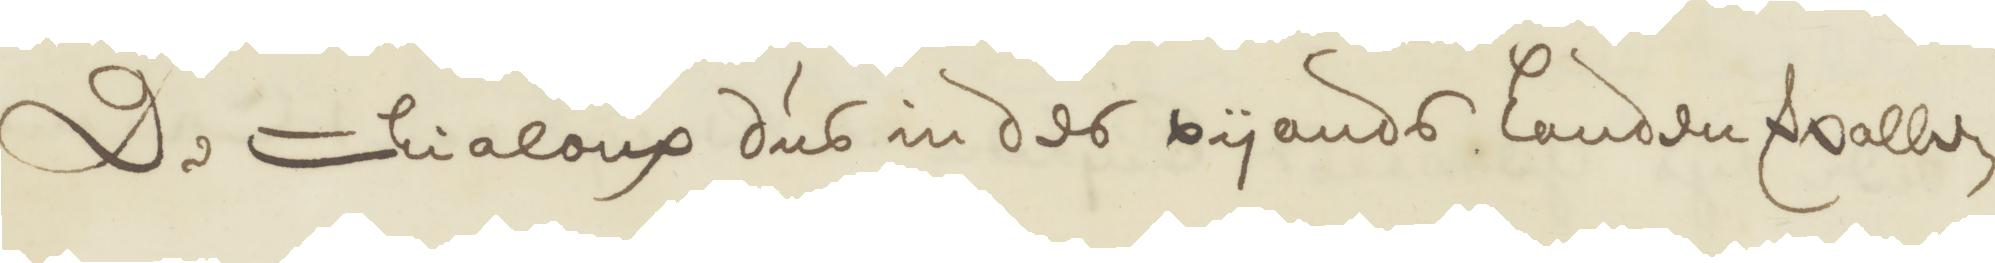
De chialoup dus in des vijands handen vervallen
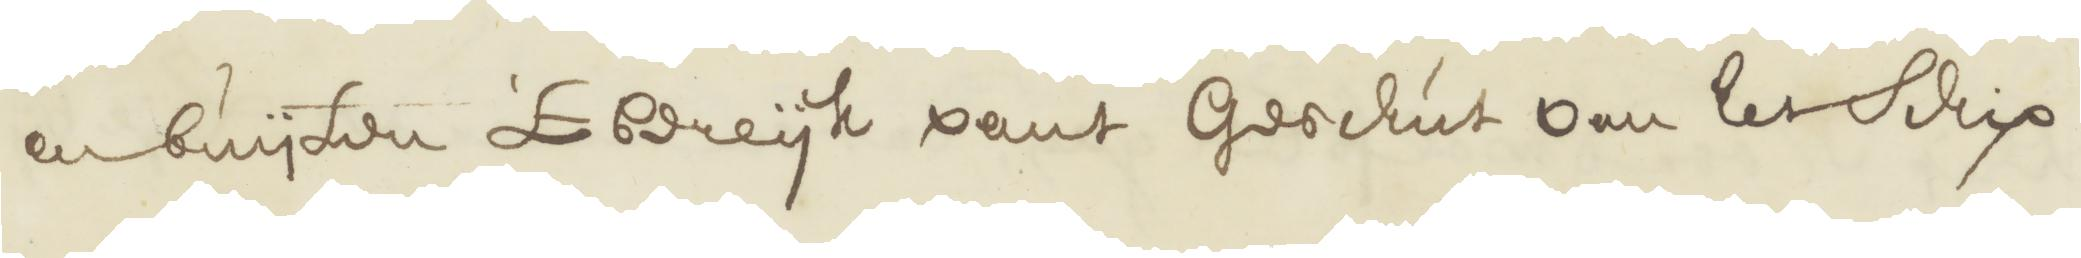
en buijten 't bereijk vant Geschut van het schip
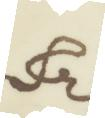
Er
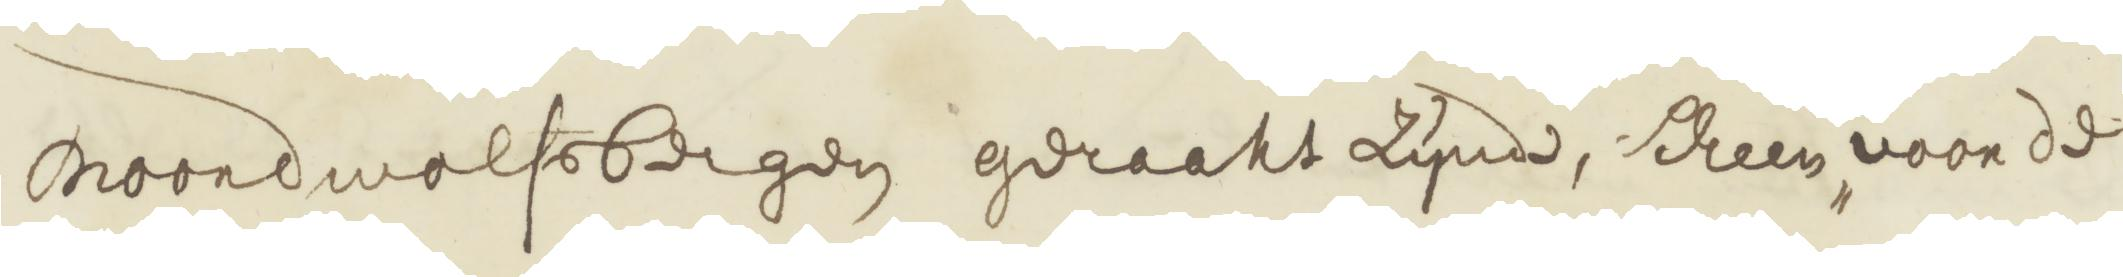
noordwolfsbergen geraakt zijnde, scheen„ voor de
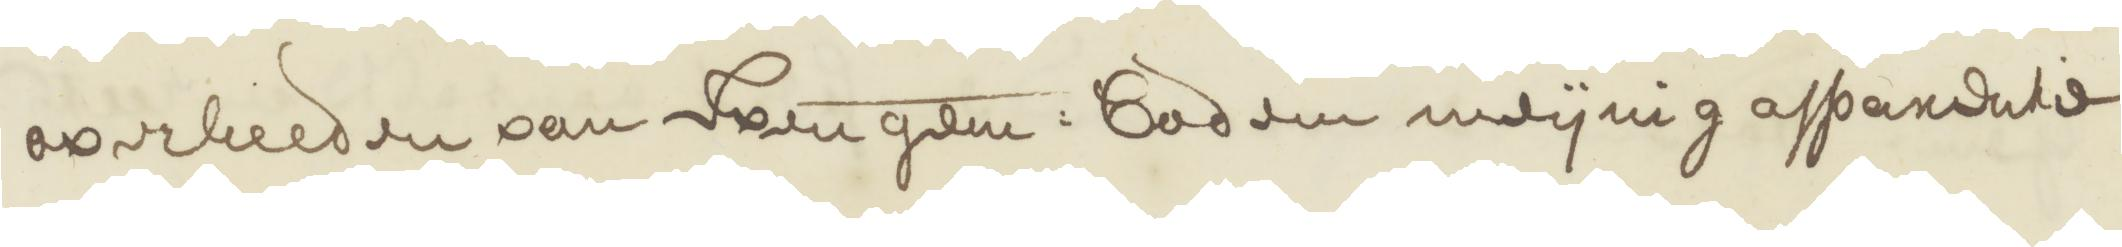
overheeden van Even gem: bodem weijnig apparentie
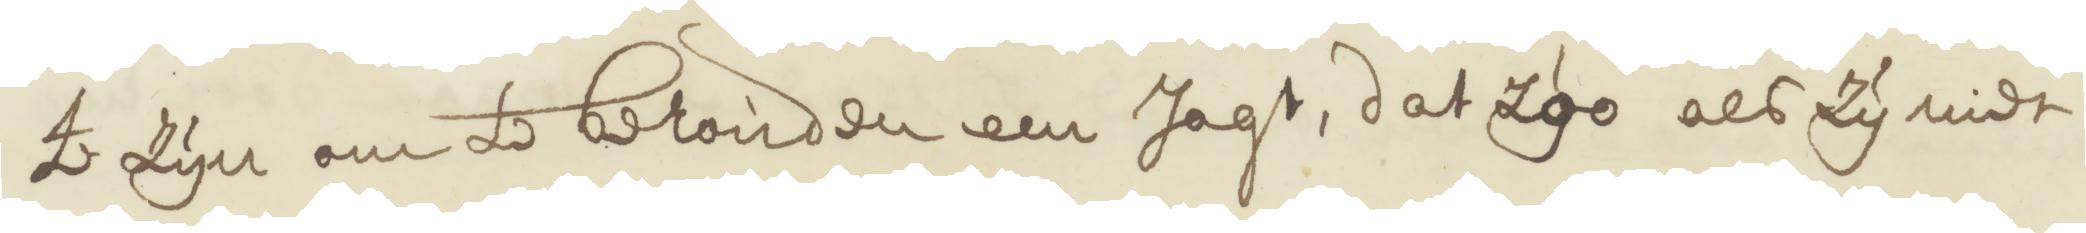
te zijn om te behouden een Jagt, dat zoo als zij niet
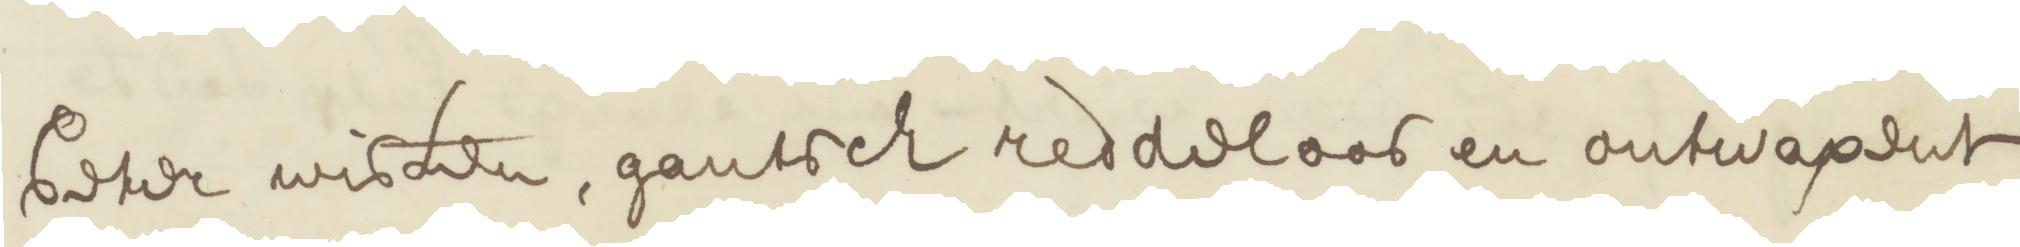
beter wisten, gantsch reddeloos en ontwapent
